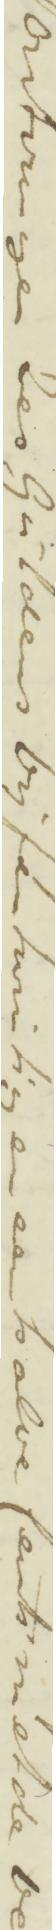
Ontvangen Zes Gulden vijfentwintig en een halve Cent met de verhoginge
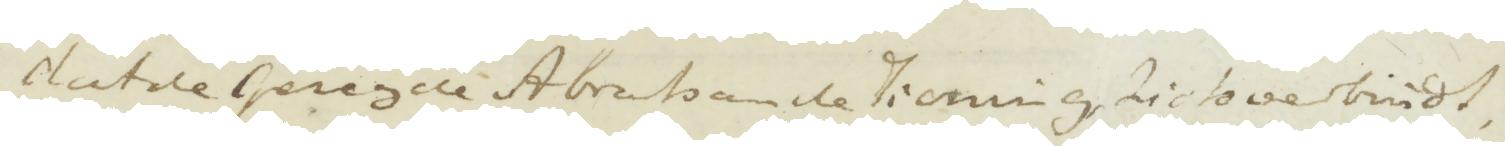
dat de Gezegde Abraham de Koning, zich verbindt,
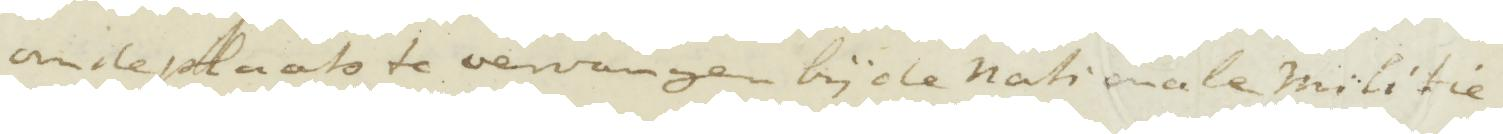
om de plaats te vervangen bij de nationale militie
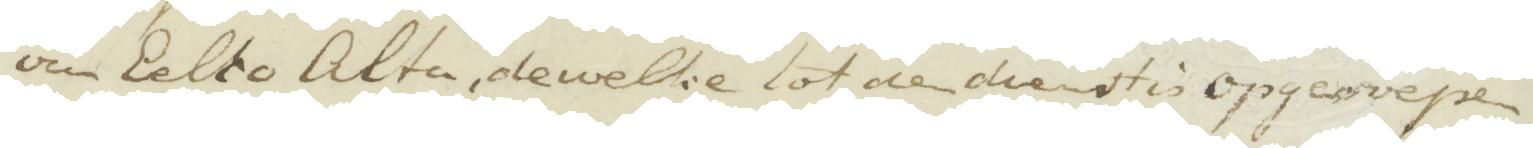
van Eelco Alta, dewelke tot den dienst is opgeroepen
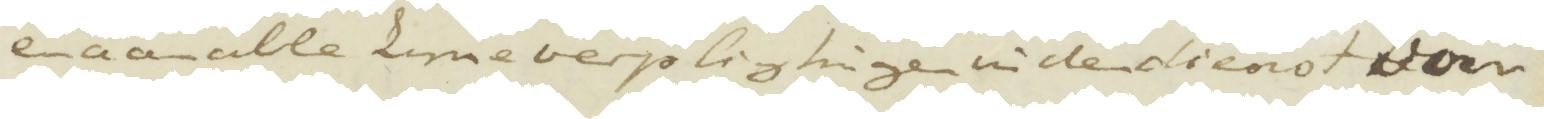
en aan alle zyne verpligtingen in den dienst voor
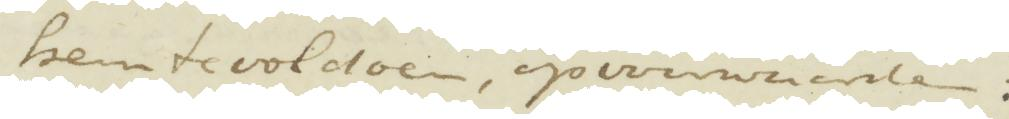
hem te voldoen, op voorwaarden:
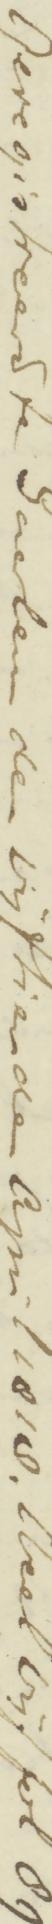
Geregistreerd Haarlem den vijftienden April 1818. deel vijf fol 89 R=o vak drie
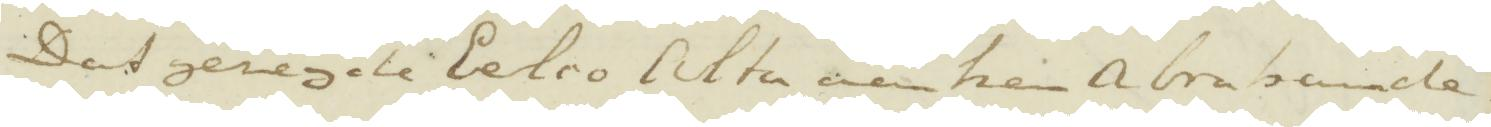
Dat gezegde Eelco Alta aan hem Abraham de
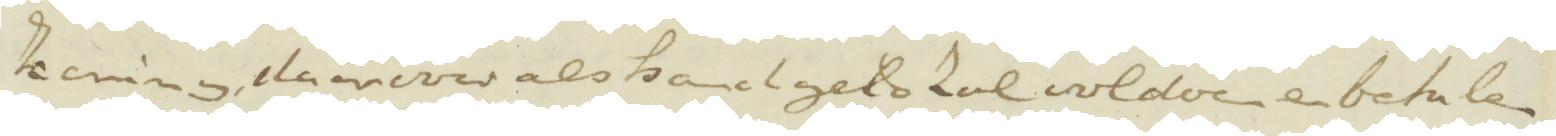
Koning, daarvoor als handgeld zal voldoen en betalen
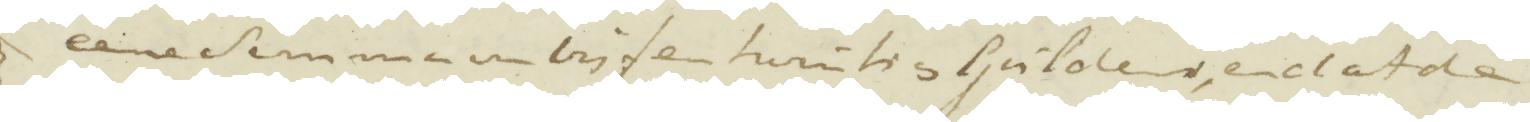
eene somma van vijf en twintig Guldens, en dat de
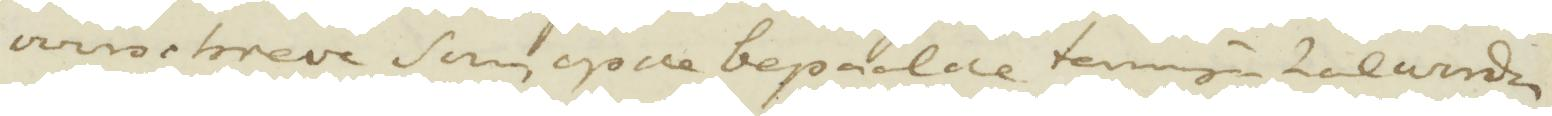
vorschreve som op de bepaalde termijn zal worden
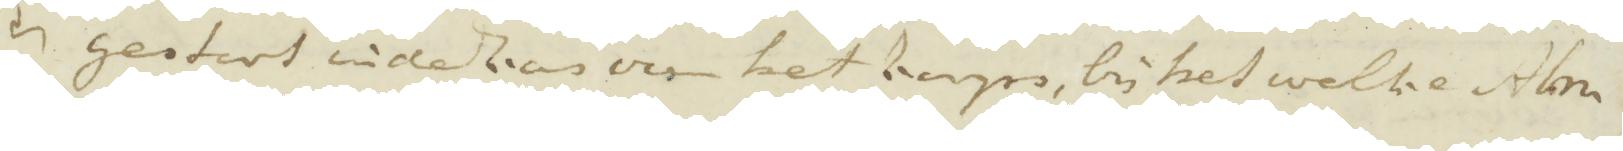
gestort in de kas van het korps, bij het welke Abra
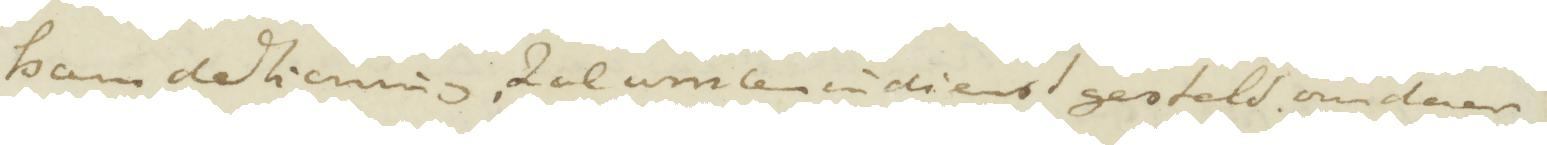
ham de koning, zal worden in dienst gesteld, om daar
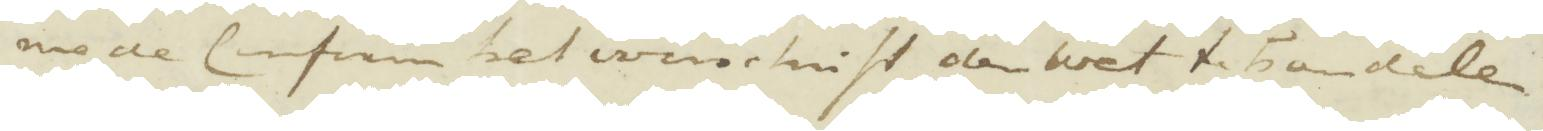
mede Conform het voorschrift der wet te handelen
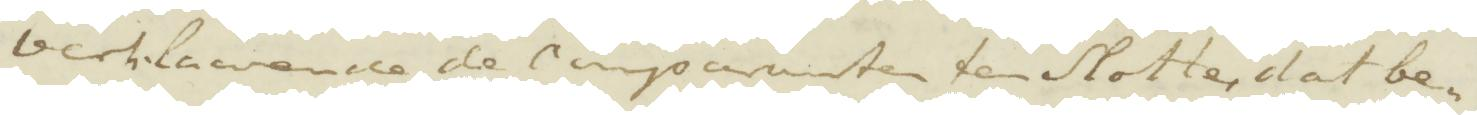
verklaarende de comparanten ten slotte, dat be„
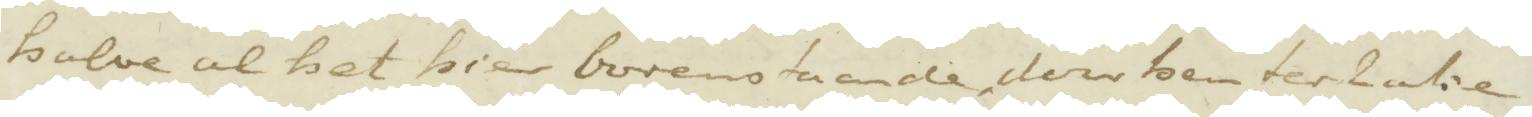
halve al het hier bovenstaande, door hem ter zake
